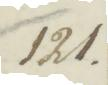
121.
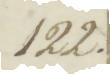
122.
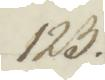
123.
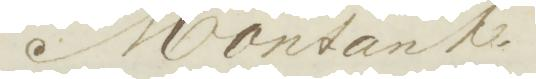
Monant.
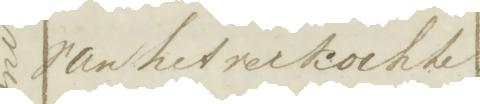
van het verkochte
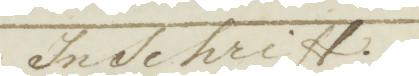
In schrift.
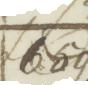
ƒ659
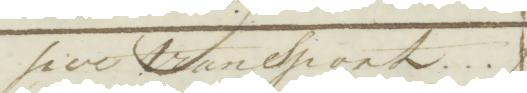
per tansport.
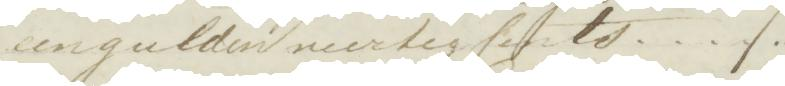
een gulden veertig Cents . . . . .
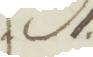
„ 1.
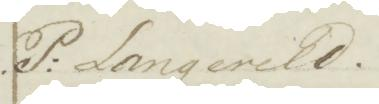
P: Langeveld . . . . . . .
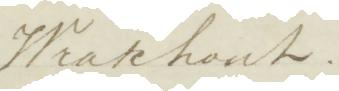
Wrakhout . . . .
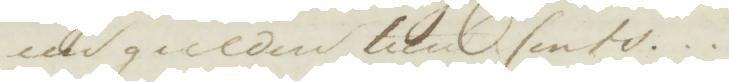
een gulden tien Cents . . . . . „
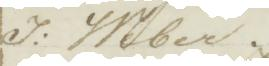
J: Weber . . . . . . . .
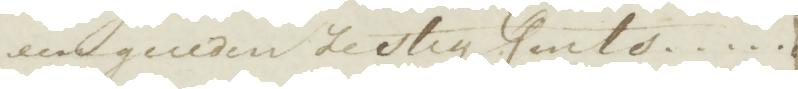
een gulden zestig Cents . . . . . „
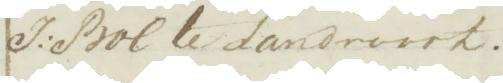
J: Bol te Zandvoort .
